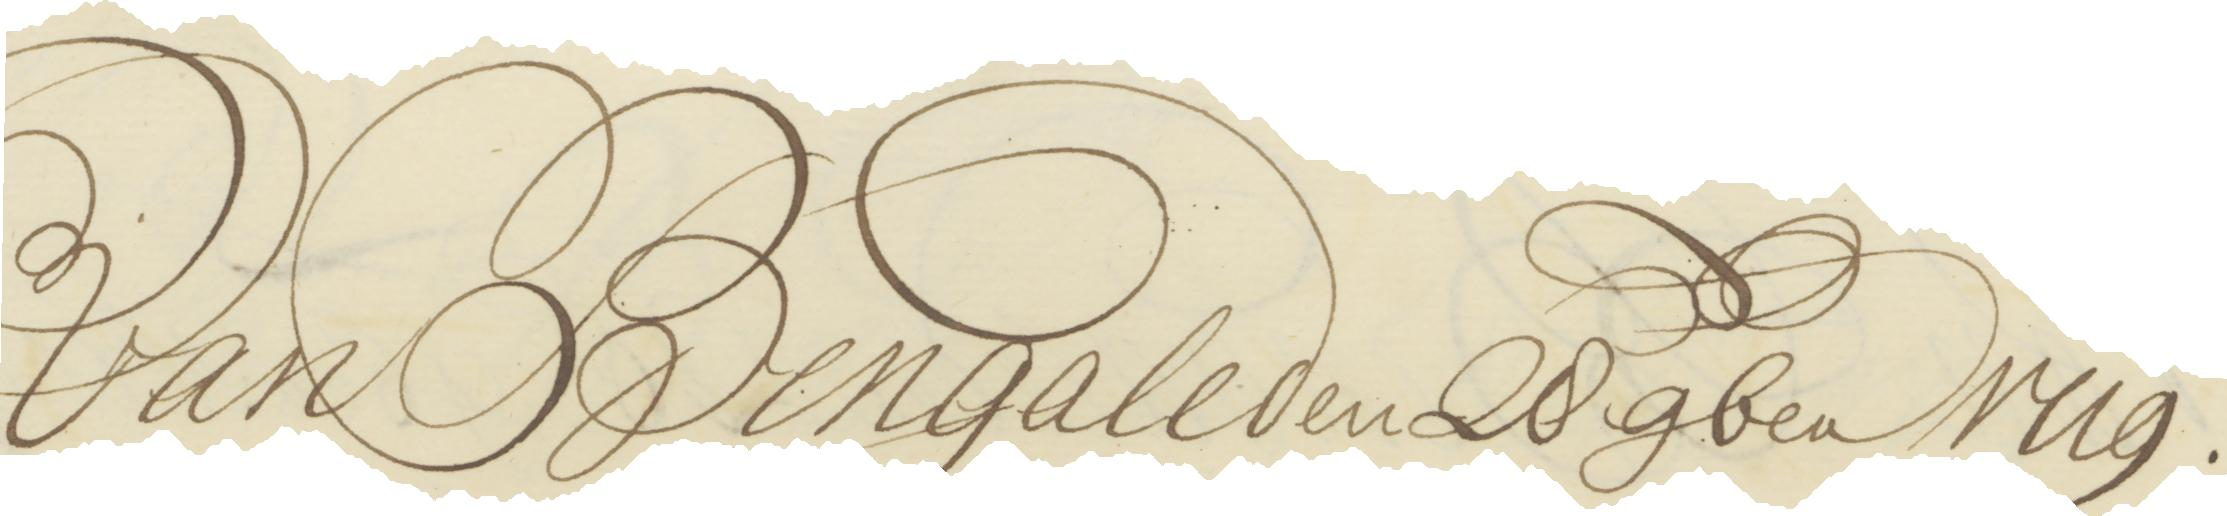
Van Bengale den 28 9ber 1719.
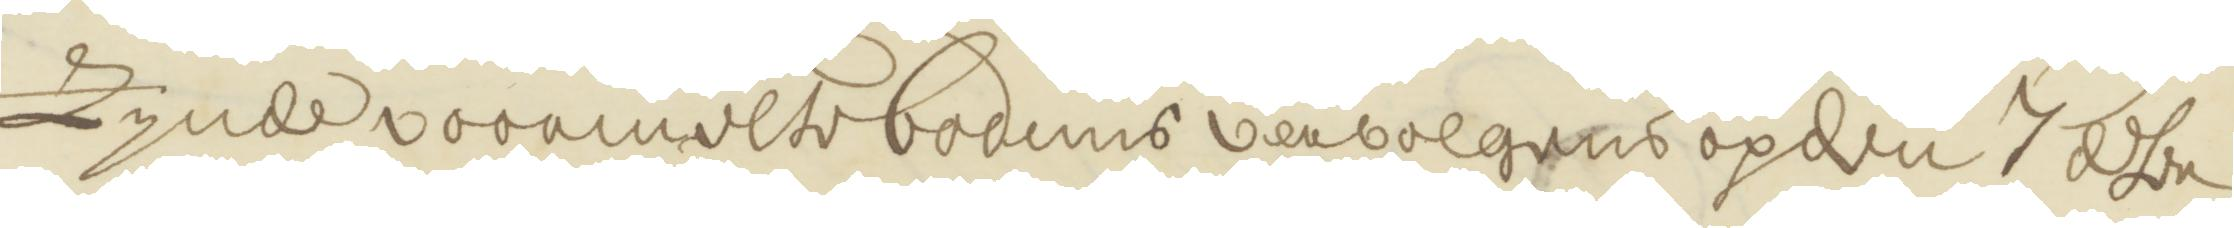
Zijnde voormelte bodems vervolgens op den 7 deser
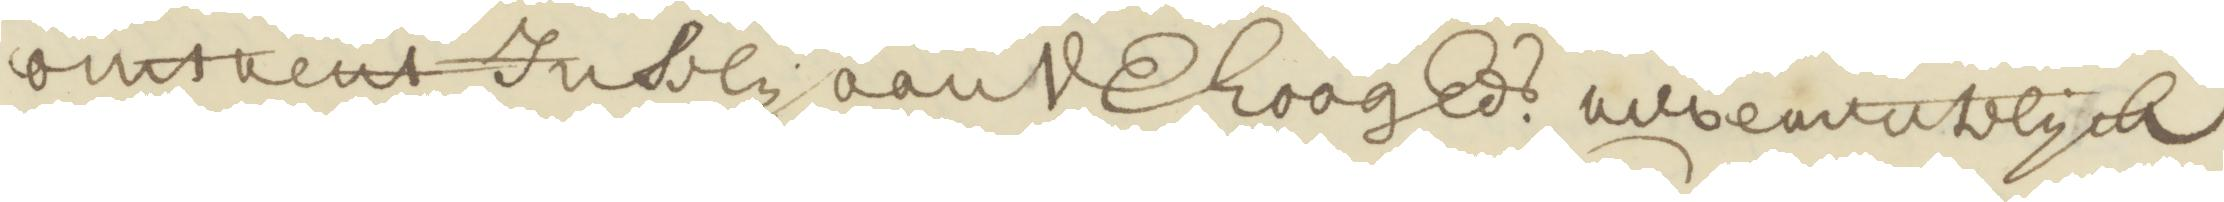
omtrent Inselij aan VE hoog Ed.s reverentelijck
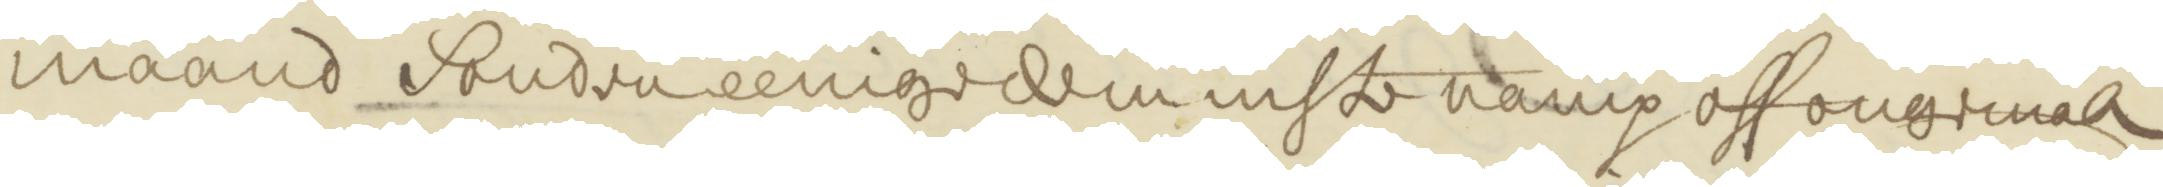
maand sonder eenige deminste ramp off ongemak
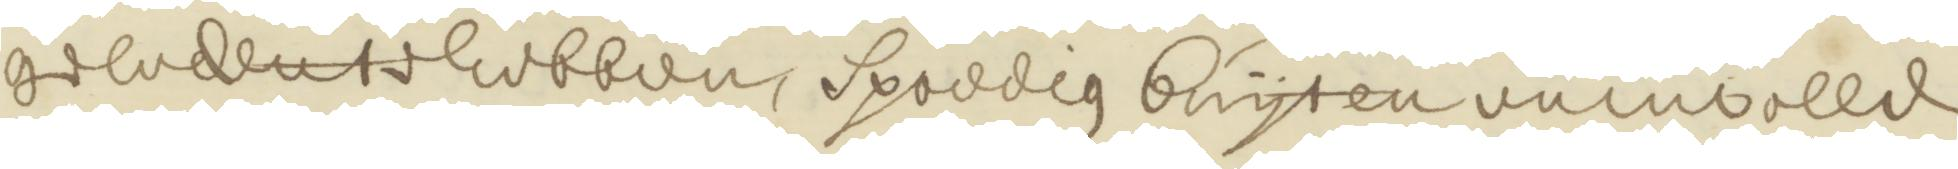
geleden te hebben, spoedig buijten en in volle
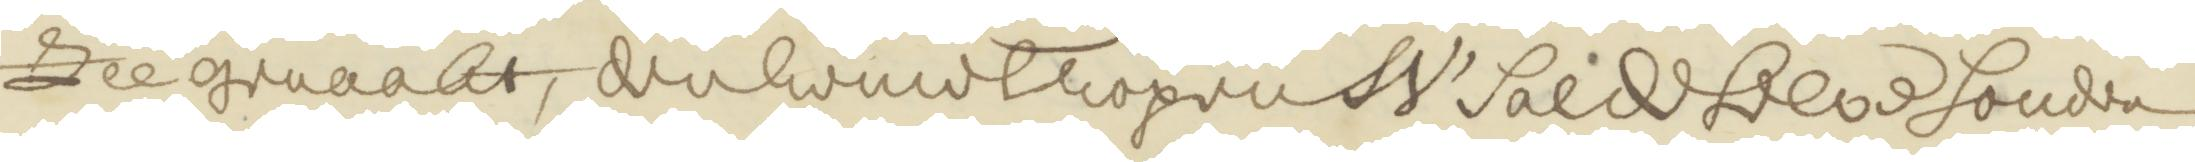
Zee geraakt, den heuvelhopen W' sal deselve sonder
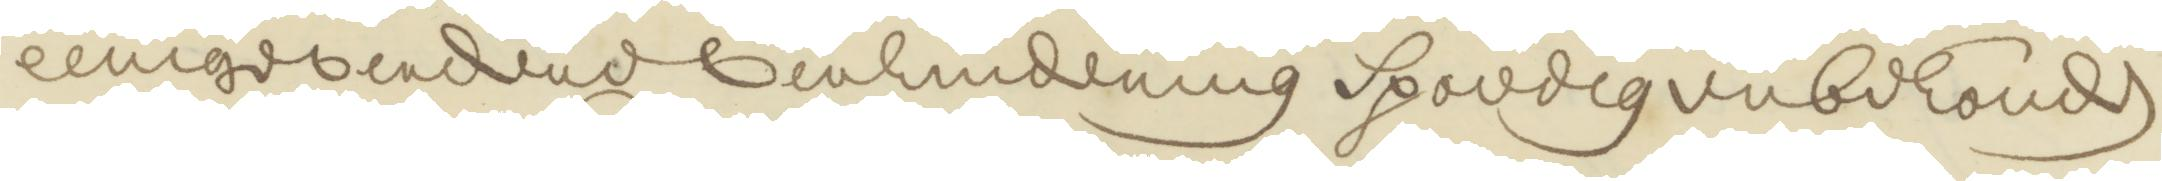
eenige verdere verhindering spoedig en behouden
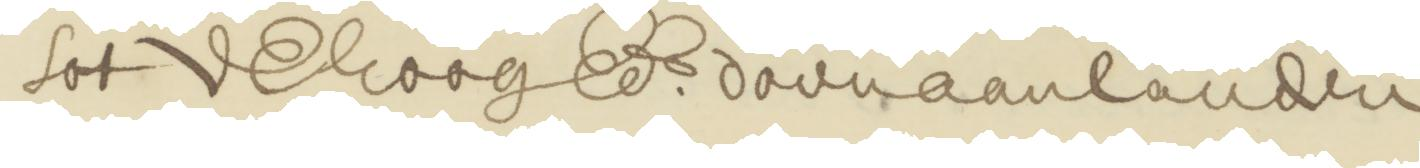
tot VE hoog Ed.s doen aanlanden
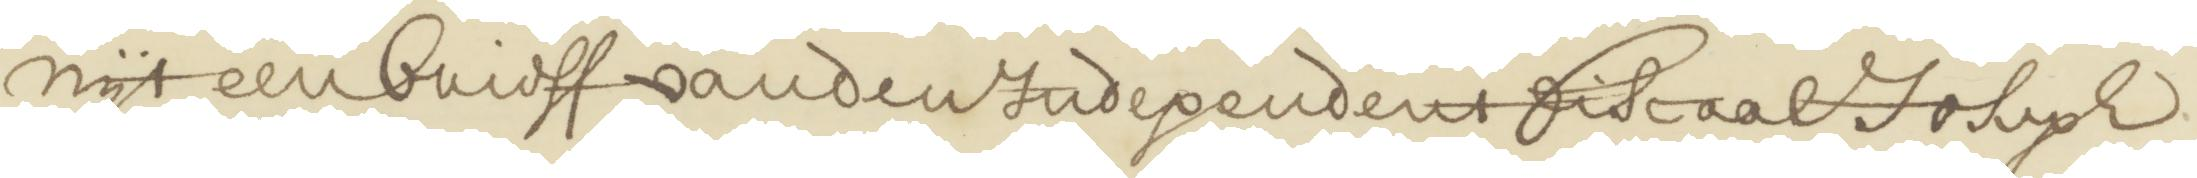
uijt een brieff van den Independent fiscaal Joseph
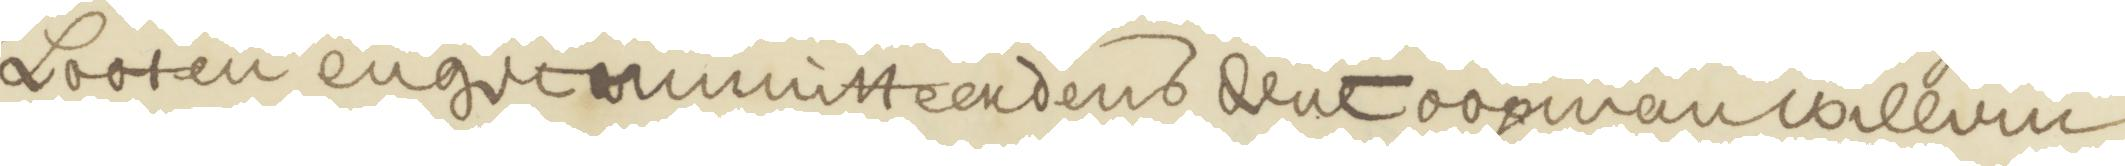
Looten en gecommitteerdens den Coopman willem
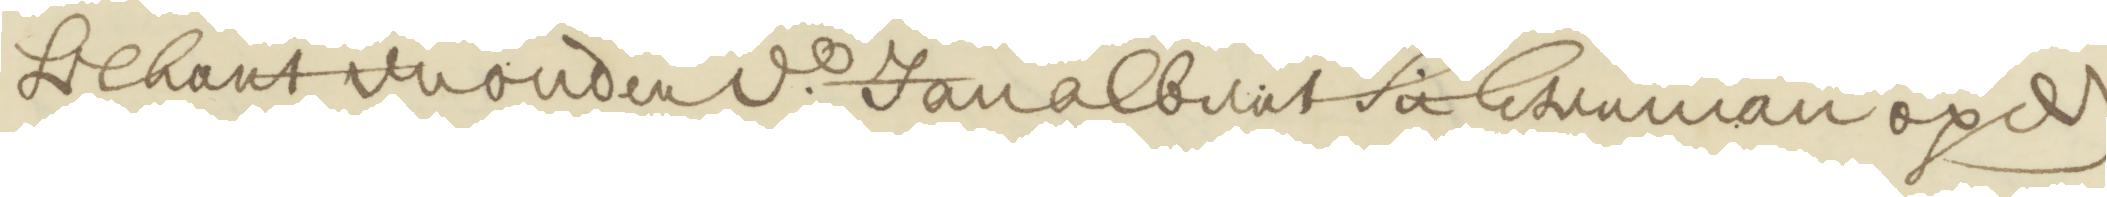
Lelhart en onder d.o Ianalbert sakterman op den
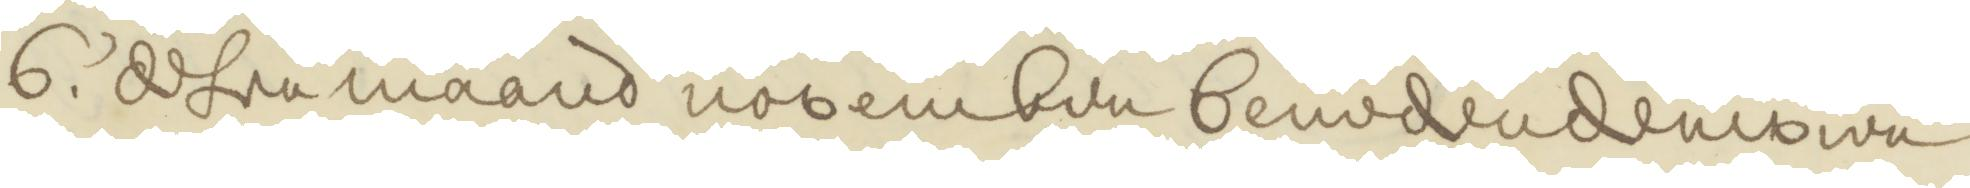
6. deser maand november beneden de rivier
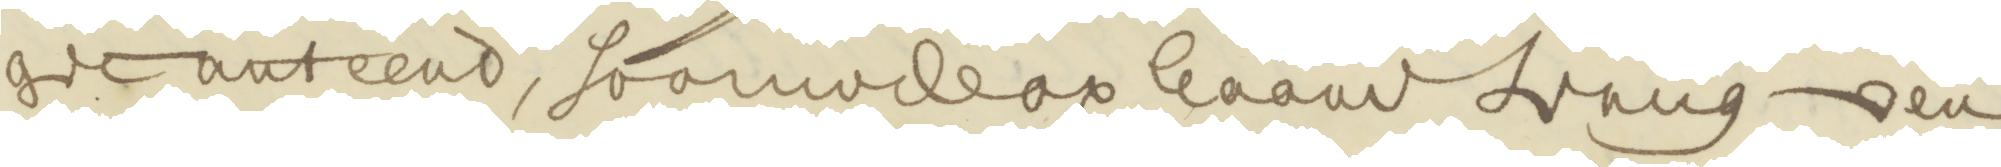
gecarteerd, soomede op haare terug ver
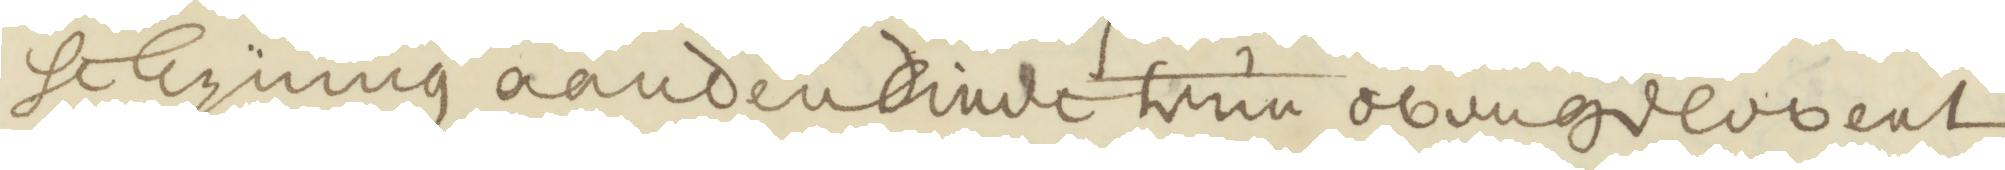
schijning aan den directeur overgelevert
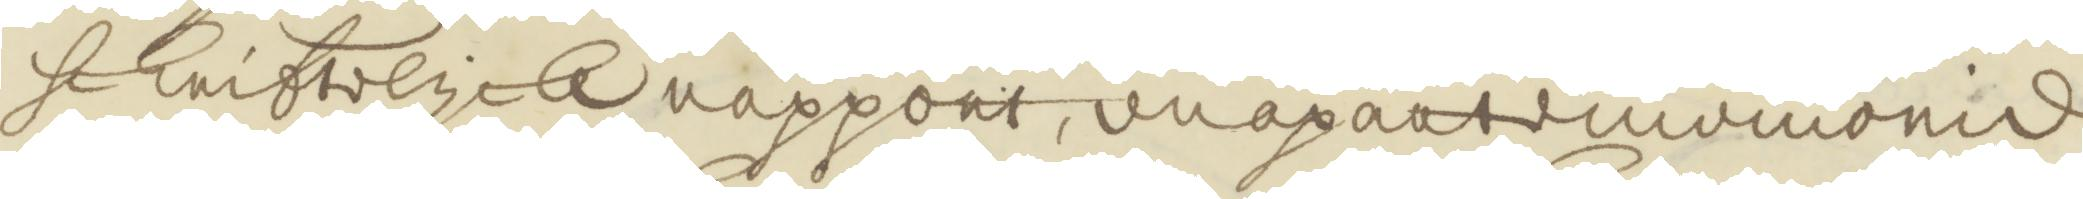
schriftelijck rapport, en aparte memorie
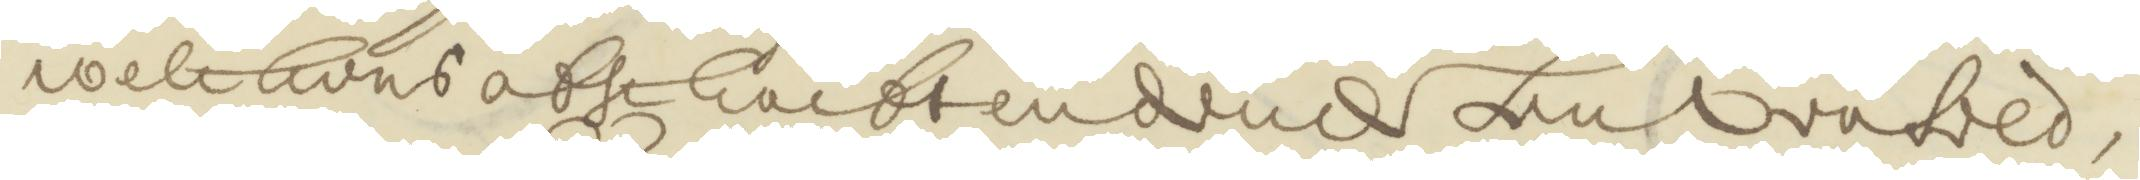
welckers afschrift en den desen verseld,
